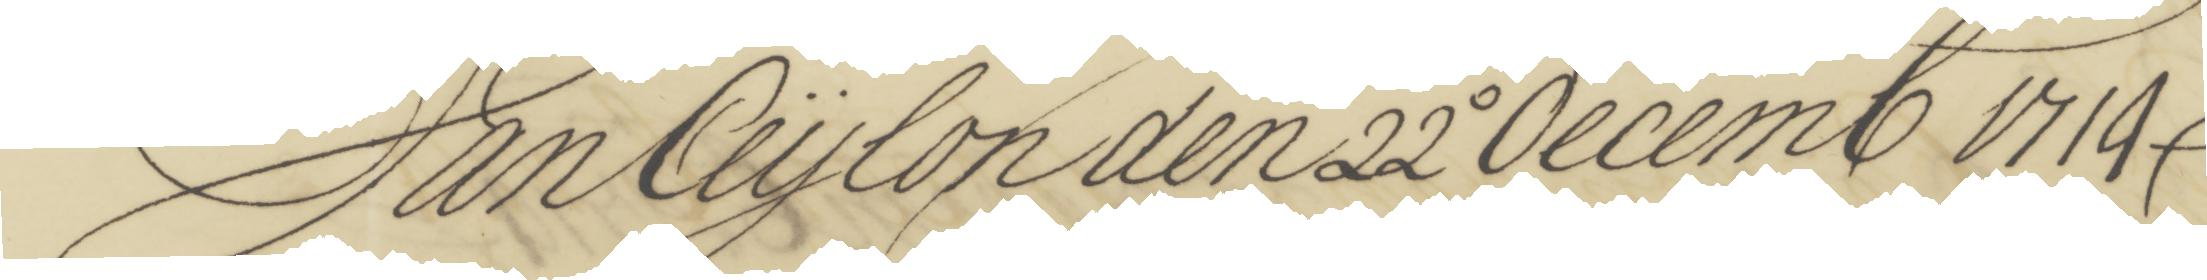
Van Ceijlon den 22o decemb 1714
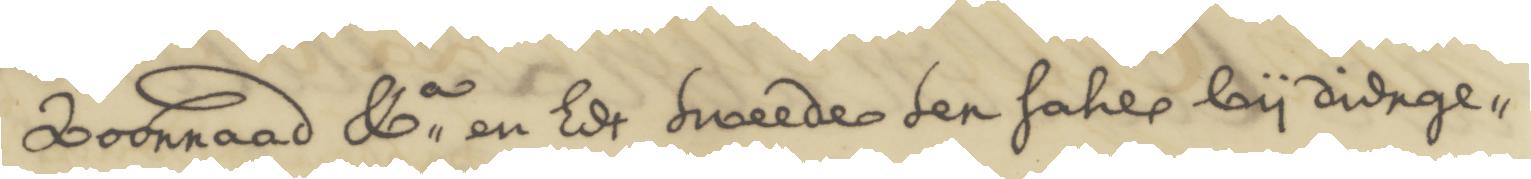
voorraad &„a en het tweede ter sake bij dierge„
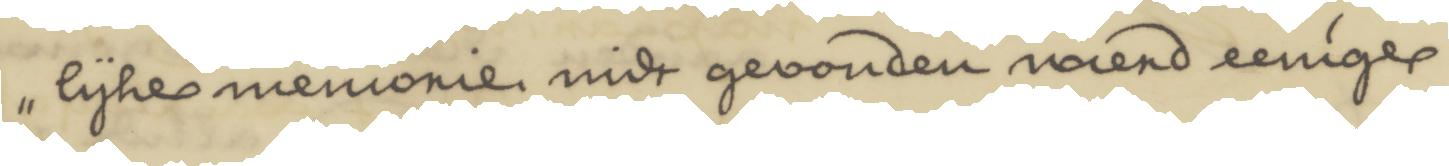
„lijke memorie niet gevonden wierd eenige
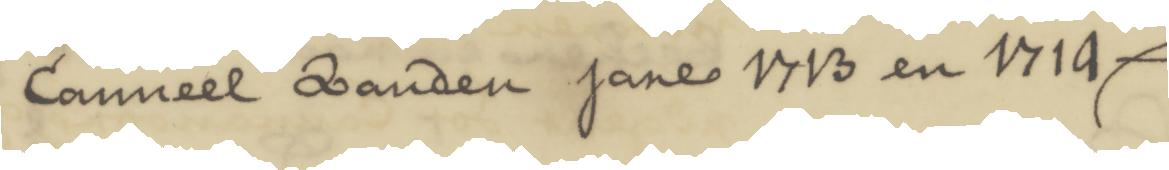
Canneel van den jare 1713 en 1714
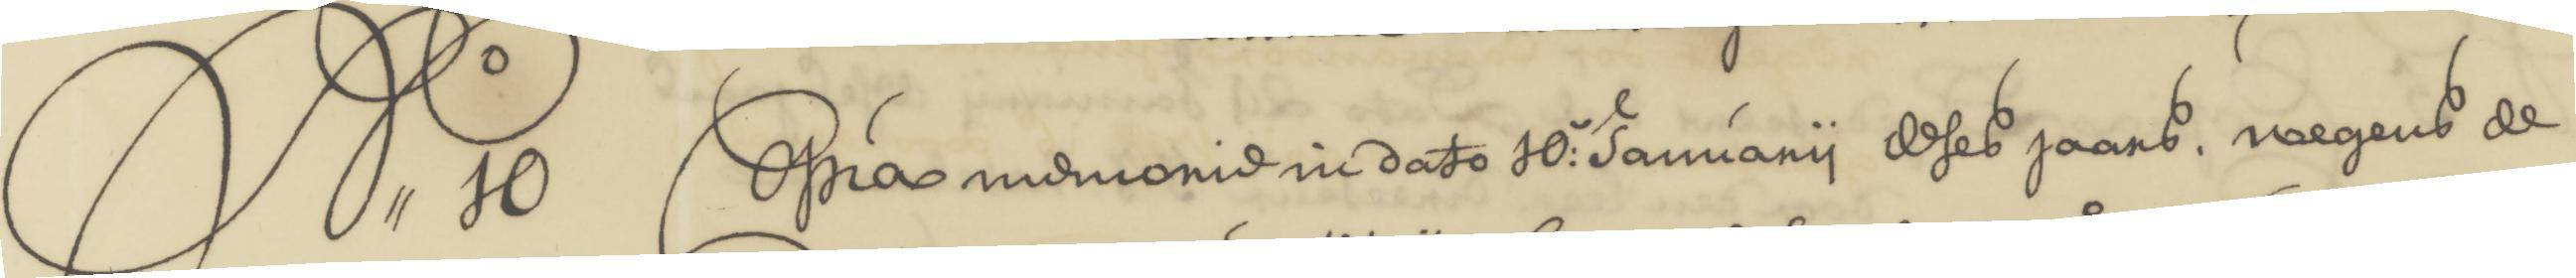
N„o 10 Copia memorie in dato 10:' Ianuarij deses jaars, wegens de
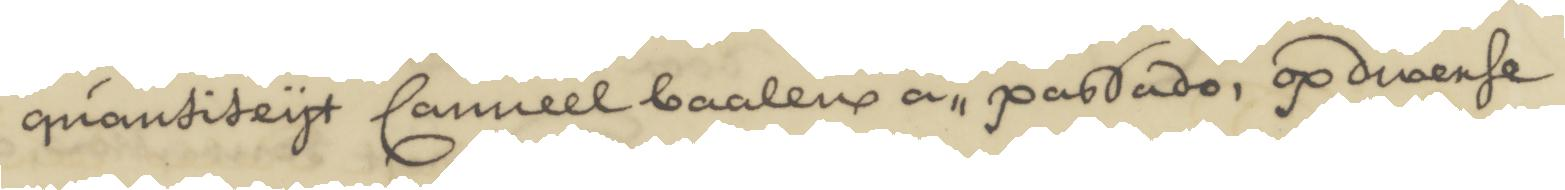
quantiteijt Canneel baalen a„o passado, op diverse
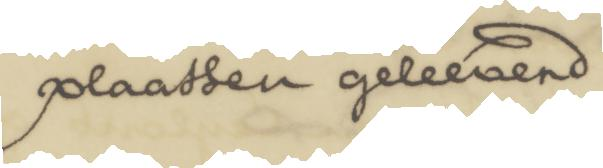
plaatsen geleeverd
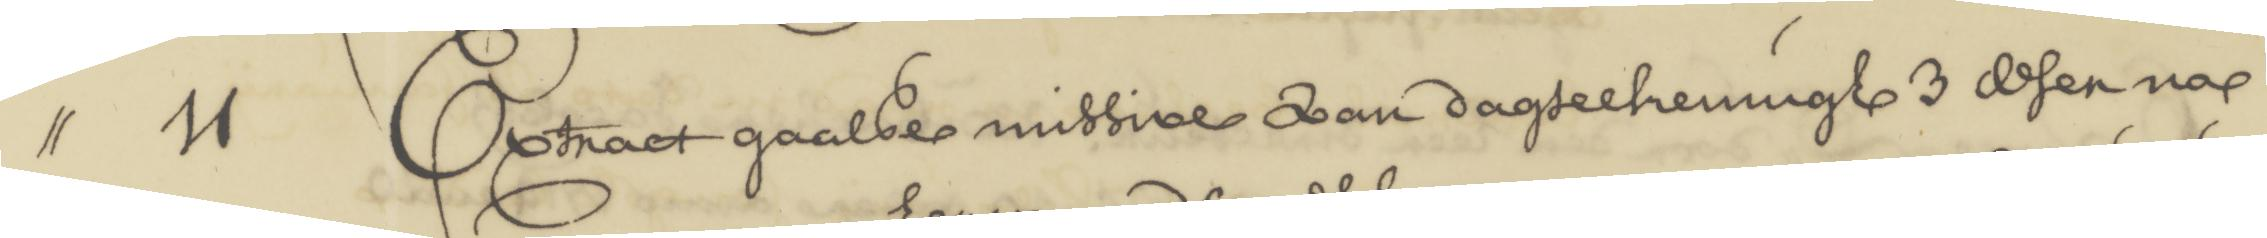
„ 11 Extract gaalse missive van dagteekeningh 3 deser na
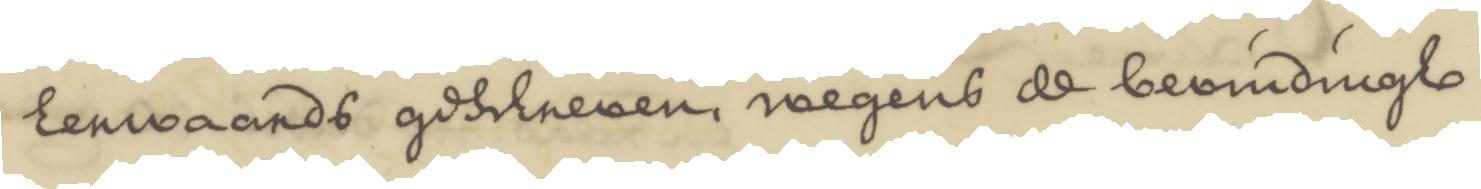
herwaards geschreven, wegens de bevindingh
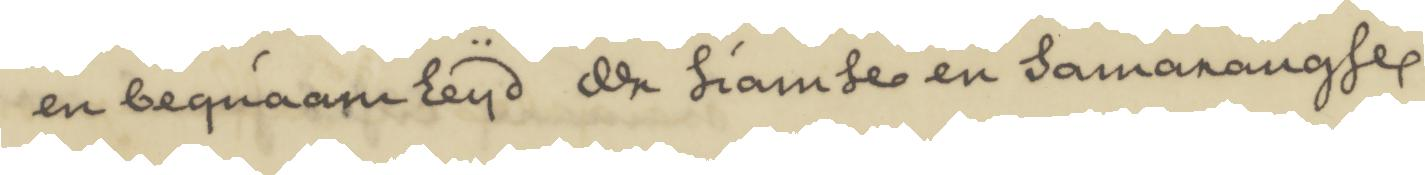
en bequaamheijd der siamse en samarangse
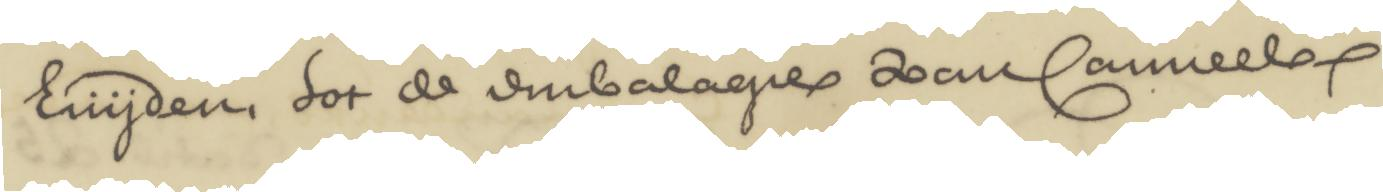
huijden, tot de embalagie van Canneel
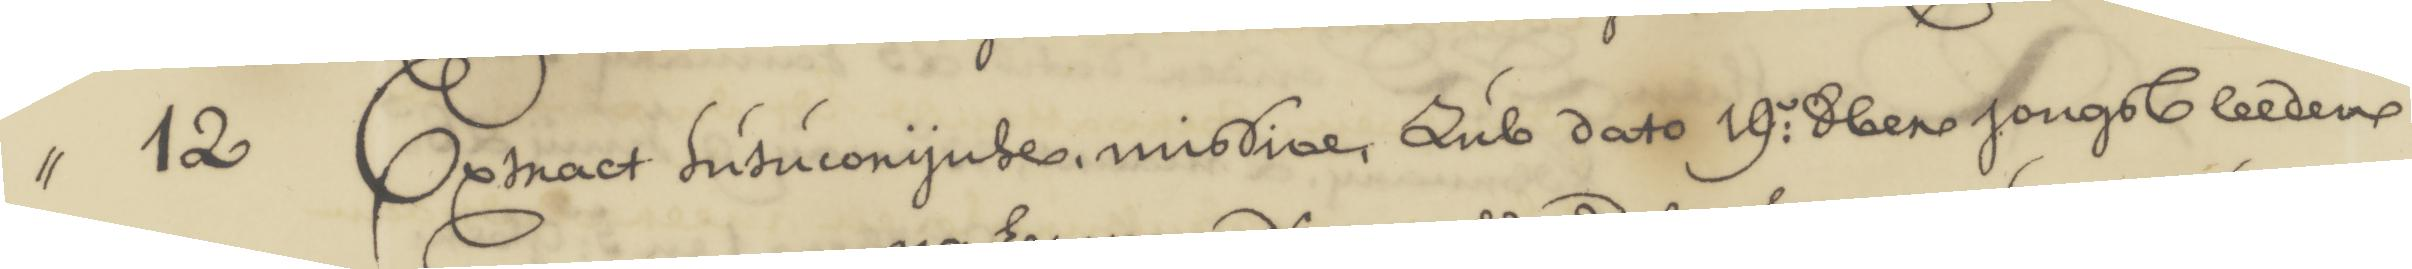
„ 12 Extract tutucorijnse, missive, Zub dato 19:' 8ber Jongstleeden
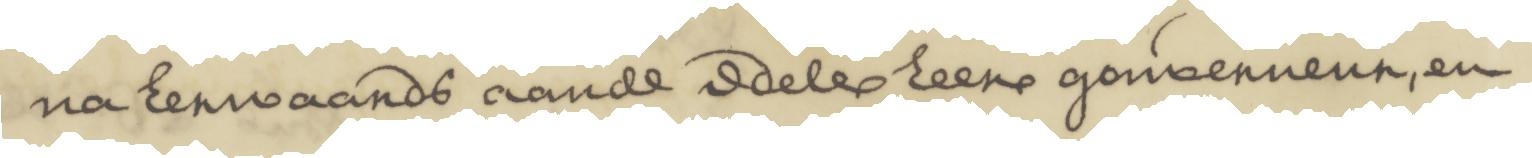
na herwaards aande Edele heer gouverneur, en
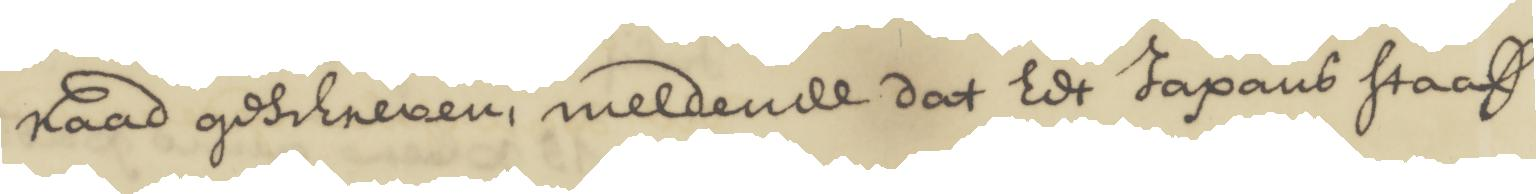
raad geschreven, meldende dat het Iapans staaf
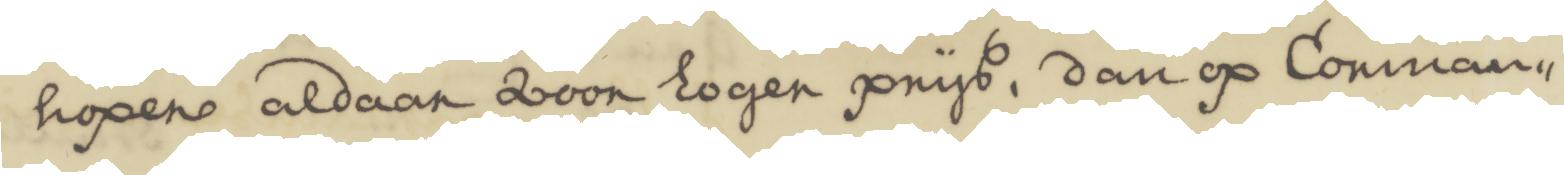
koper aldaar voor hoger prijs, dan op Corman„
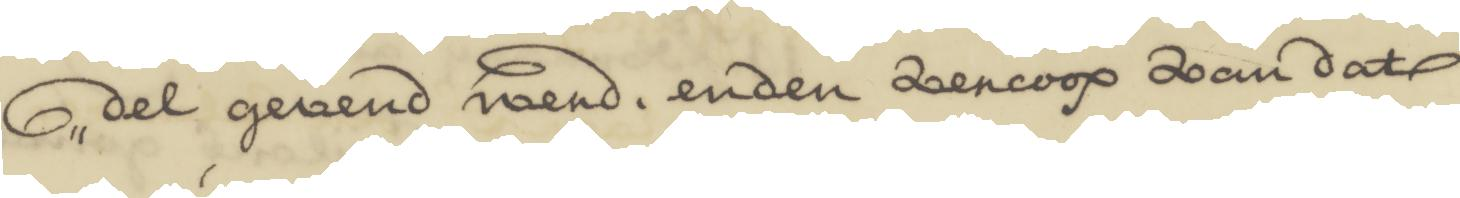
„del gevend werd, enden vercoop van dat
